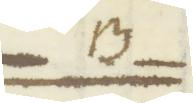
13 –
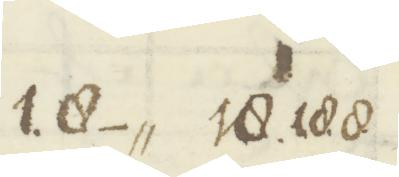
1. 8–„ 18. 18.8.
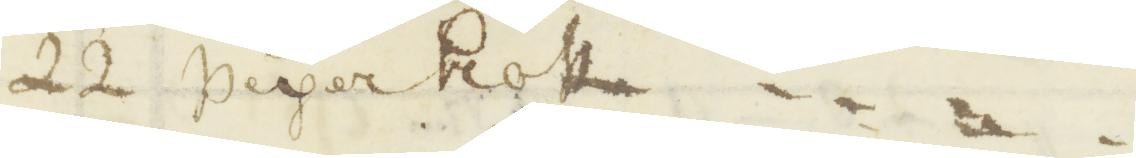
22 peper kok – – – – –
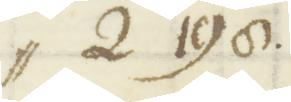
„ 2 198
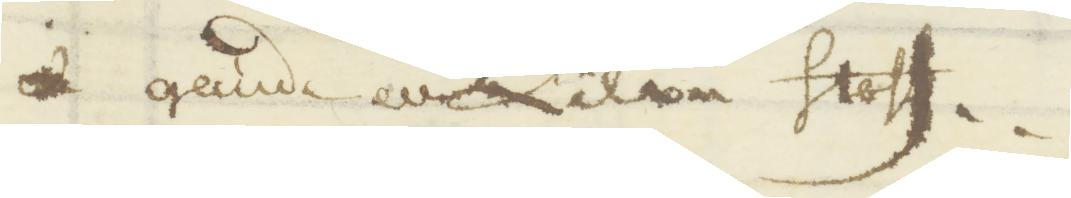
2 goude den zilver stoff - -
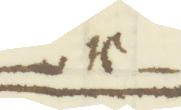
15 –
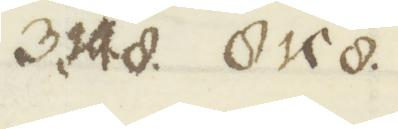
3.14.8. 8158.
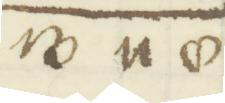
13 11 8
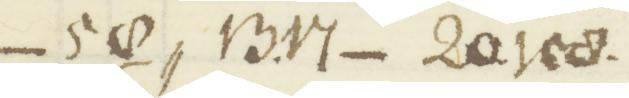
— 58 „ 13.17— 20158.
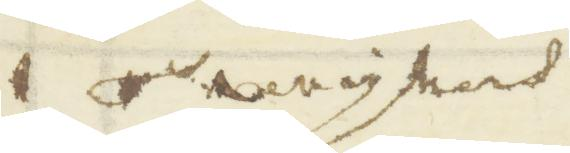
1 ps verijkers
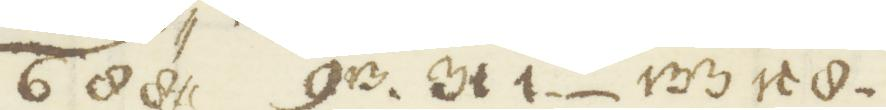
6 88„ 913„ 311- — 133 15 8 -
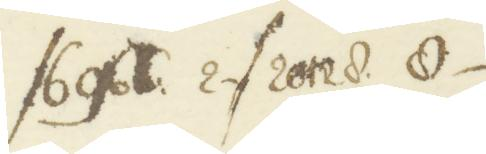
ƒ6961: 2 - ƒ 2012 8. 8
